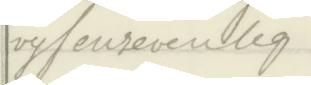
vyfenzeventig
